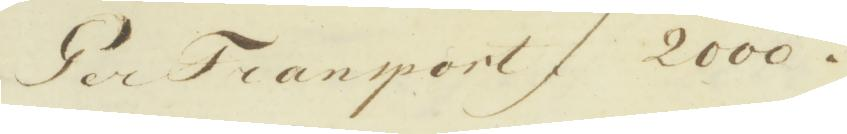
Per Transport ƒ 2000 „
